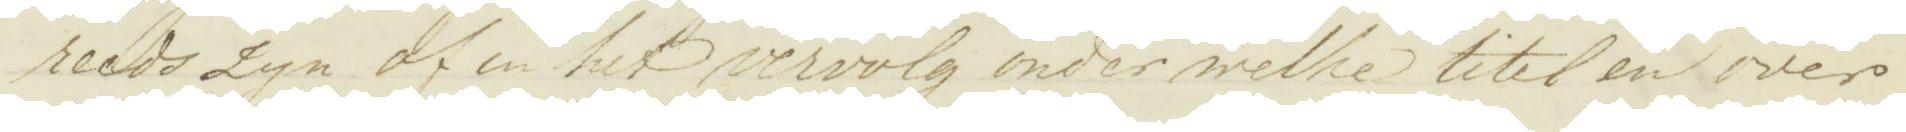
reeds zyn of in het vervolg onder welke titel en over
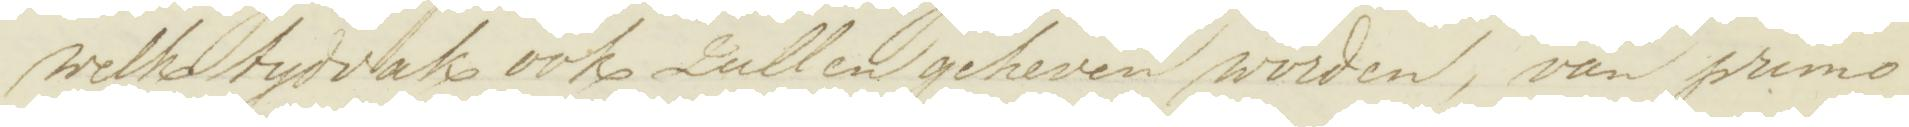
welk tydvak ook zullen geheven worden, van primo
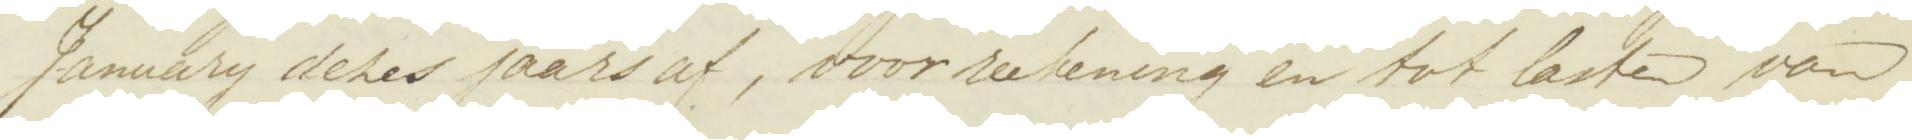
January dezes Jaars af, voor reekening en tot lasten van
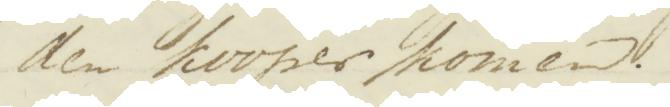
den kooper komen.
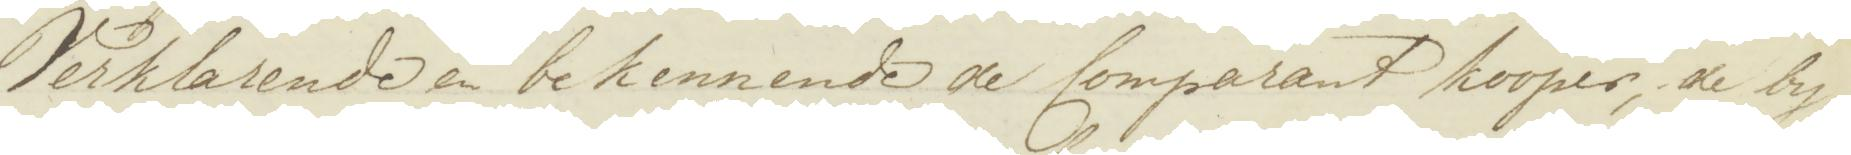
Verklarende en bekennende de Comparant kooper, de by
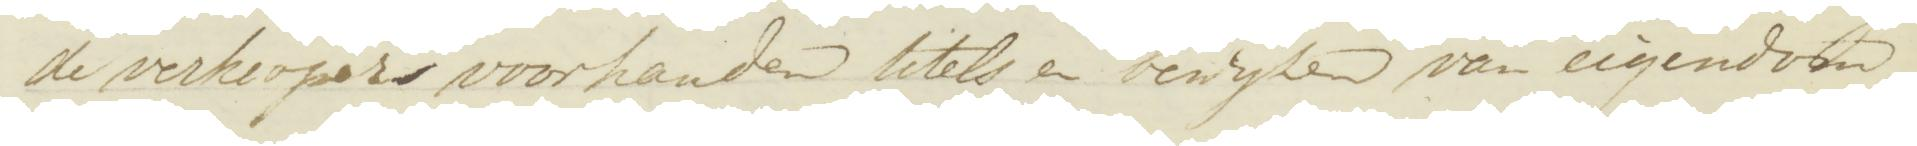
de verkoopers voorhanden titels en bewyzen van eigendom
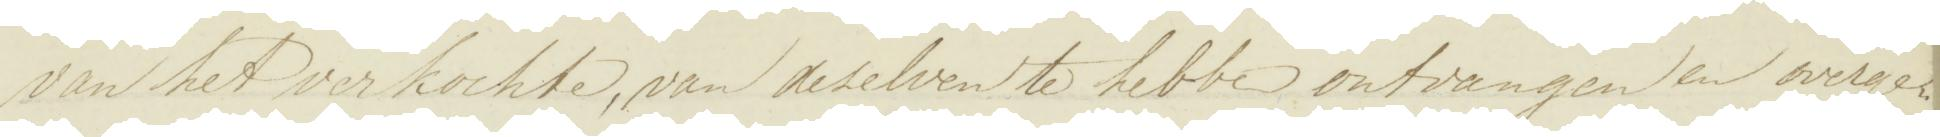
van het verkochte, van dezelven te hebbe ontvangen en overge„
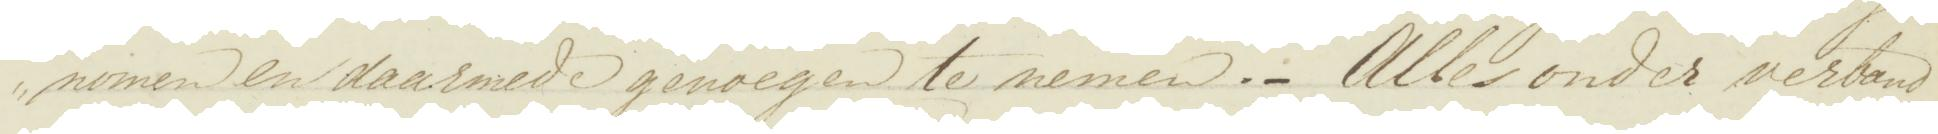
„nomen en daarmede genoegen te nemen. – Alles onder verband
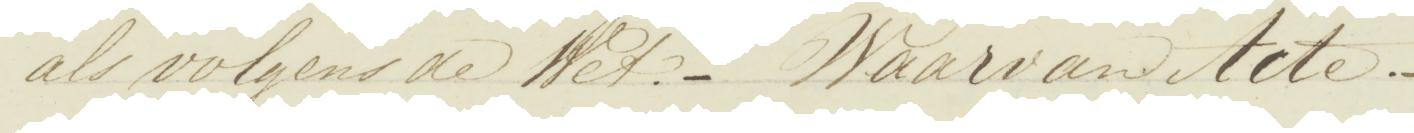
als volgens de Wet. – Waarvan Acte.
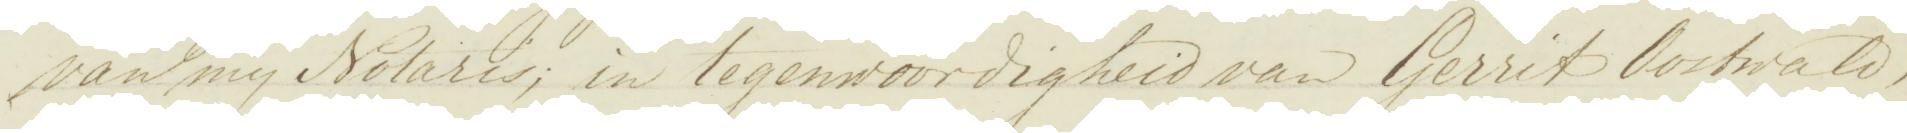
van mij Notaris; in tegenwoordigheid van Gerrit Oostwald,
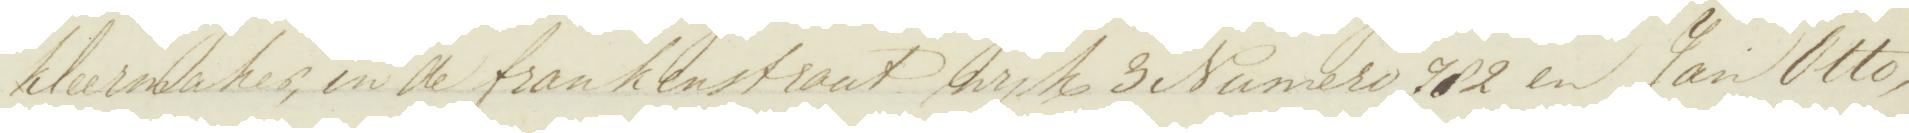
kleermaker, in de frankenstraat wyk 3 Numero 782 en Jan Otto,
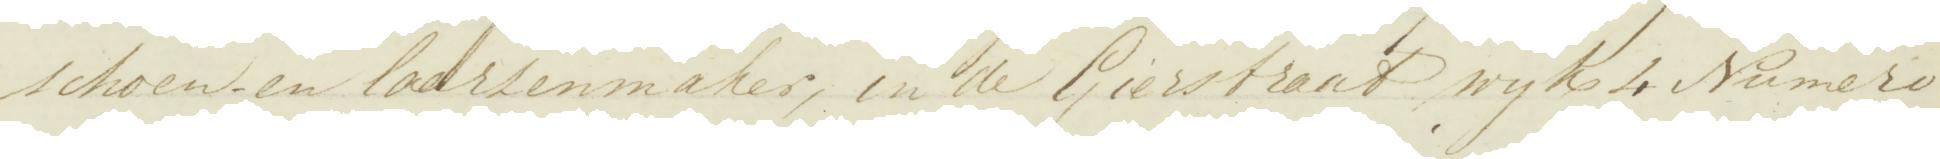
schoen- en laarzenmaker, in de Gierstraat wyk 4 Numero
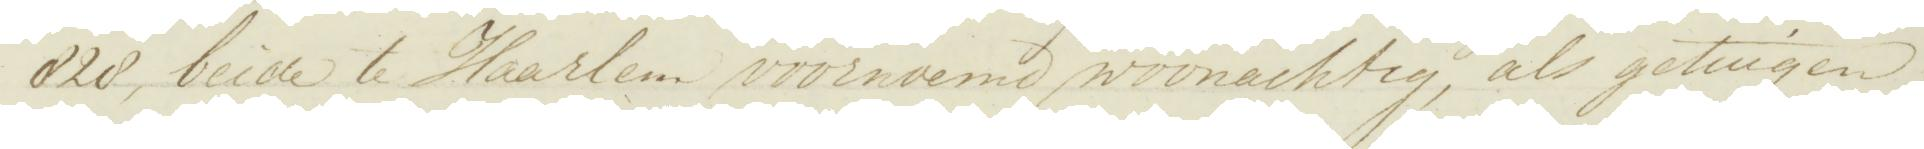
828, beide te Haarlem voornoemd woonachtig, als getuigen
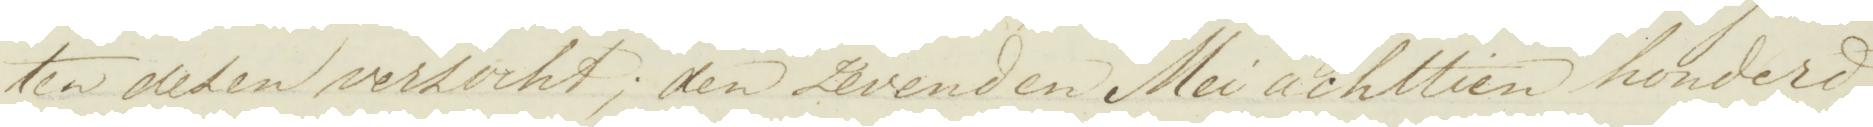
ten dezen verzocht; den zevenden Mei achttien honderd
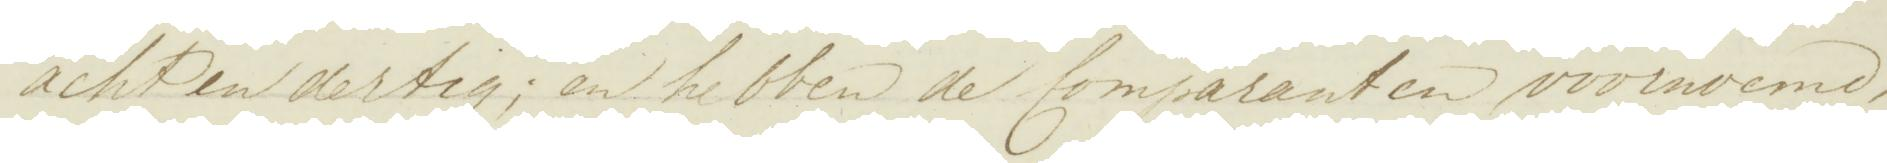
acht en dertig; en hebben de Comparanten voornoemd
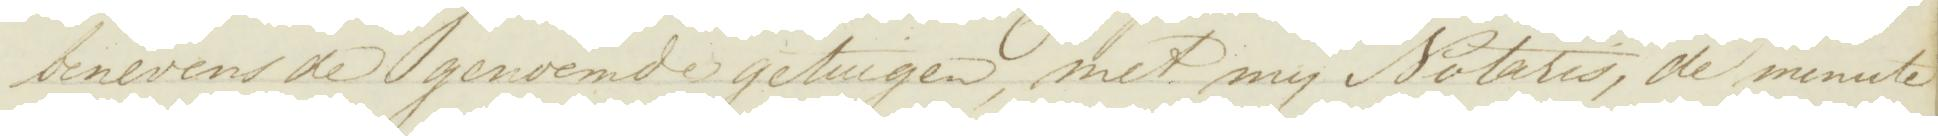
benevens de genoemde getuigen, met my Notaris, de minute
